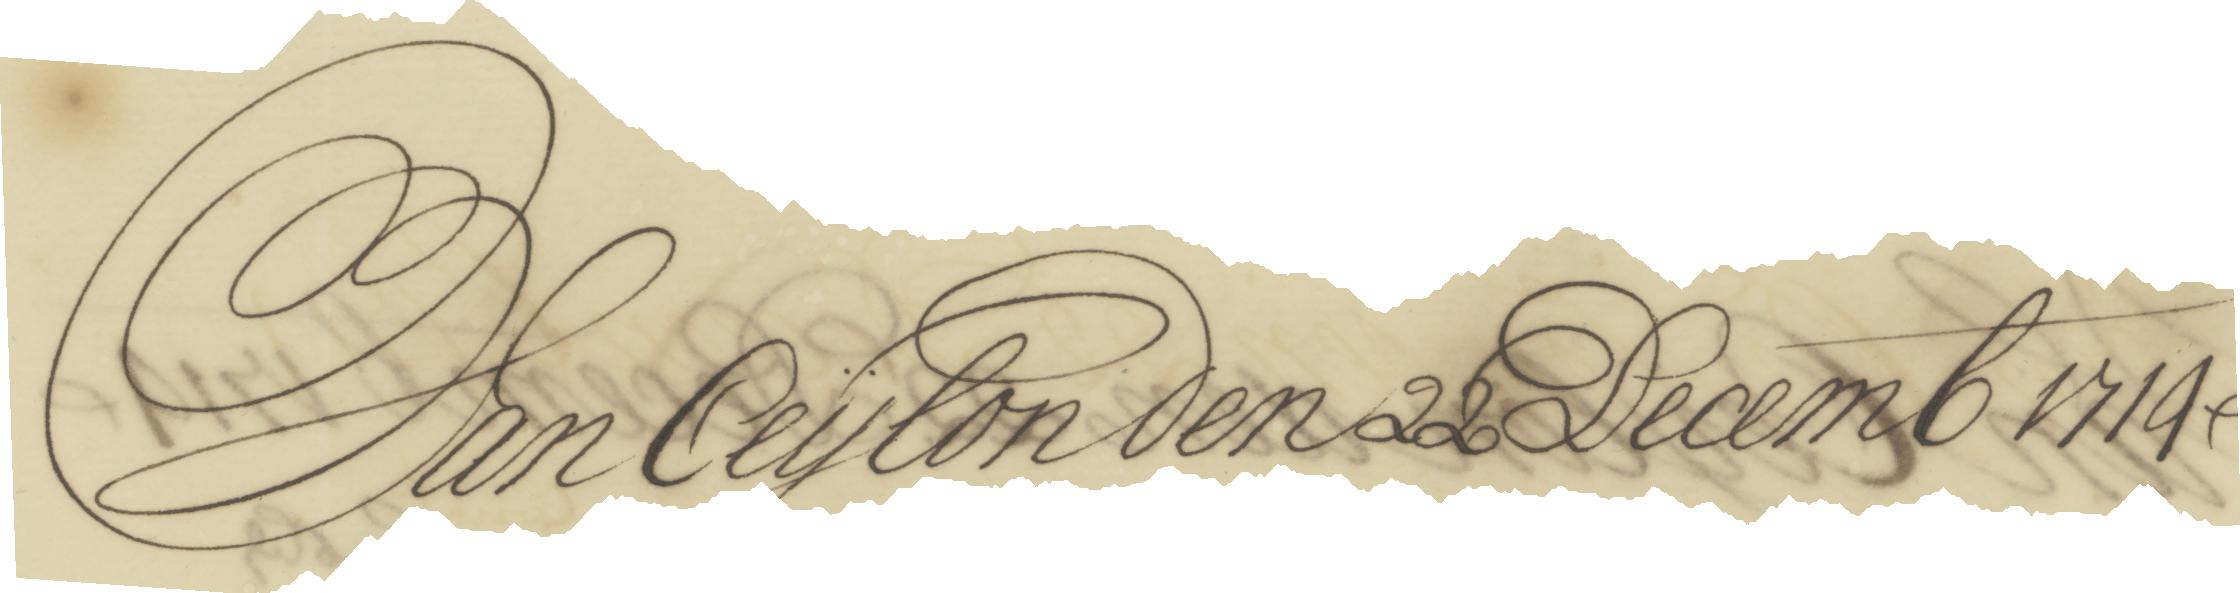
Van Ceijlon den 22 Decemb 1714
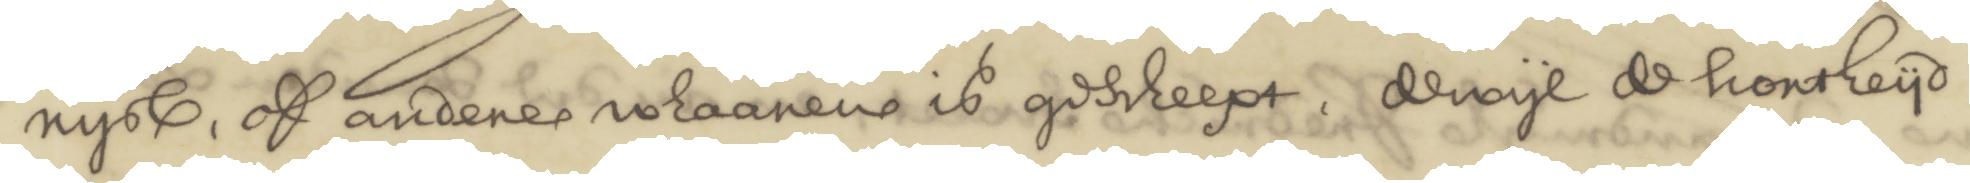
rijst, of andere whaaren is gescheept, dewijl de kortheijd
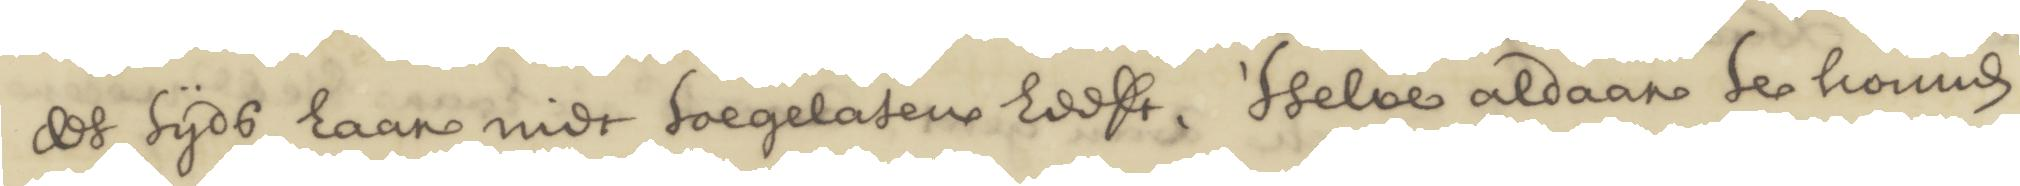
des tijds haar niet toegelaten heeft, 'tselve aldaar te konnen
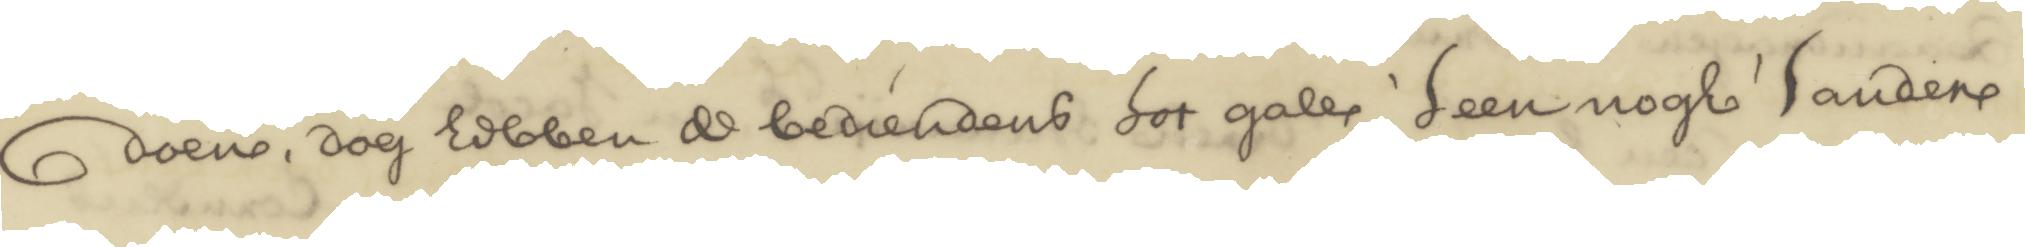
doen, dog hebben de bediendens tot gale 't een nogh 't ander
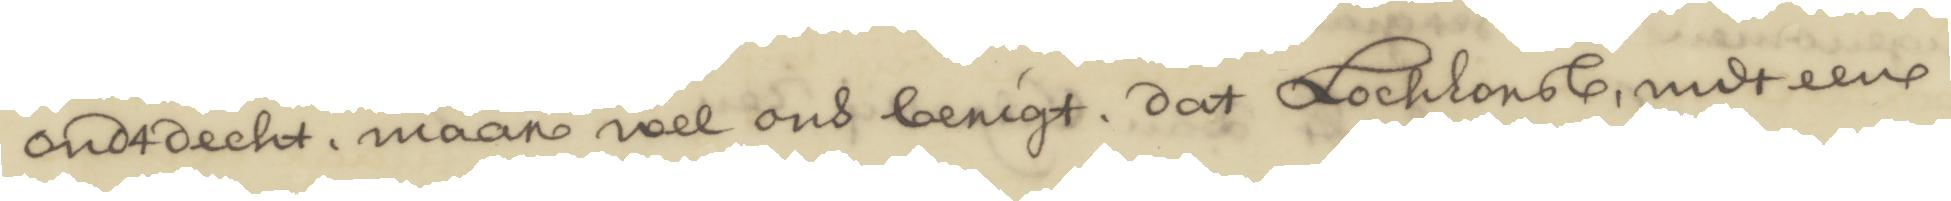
ondtdeckt, maar wel ons berigt. dat Lockhorst, met een
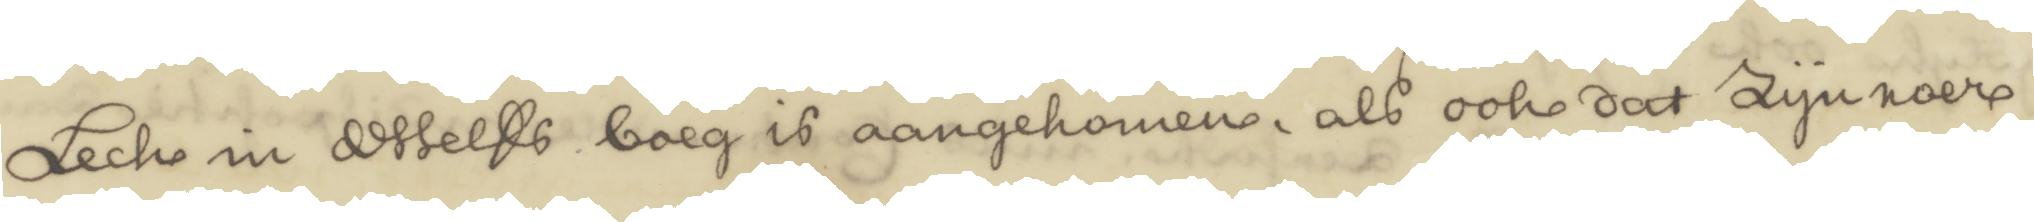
Leck in desselfs boeg is aangekomen, als ook dat zijn roer
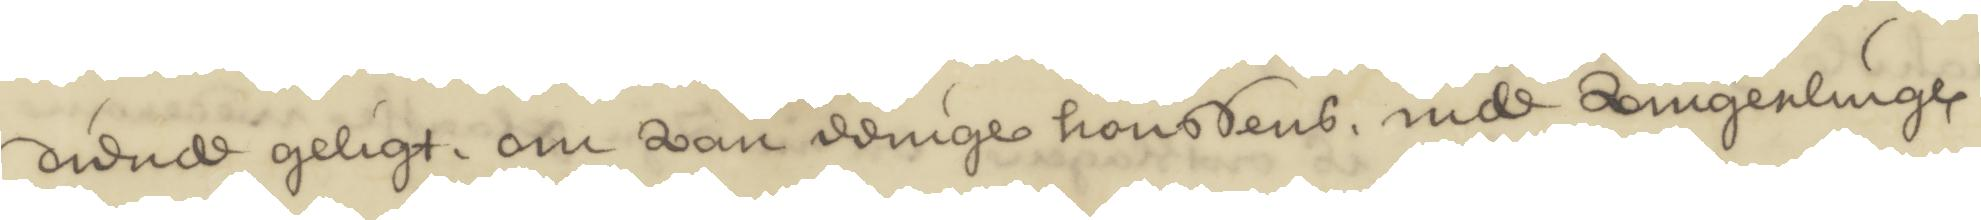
diende geligt, om van eenige koussens, inde vingerlinge
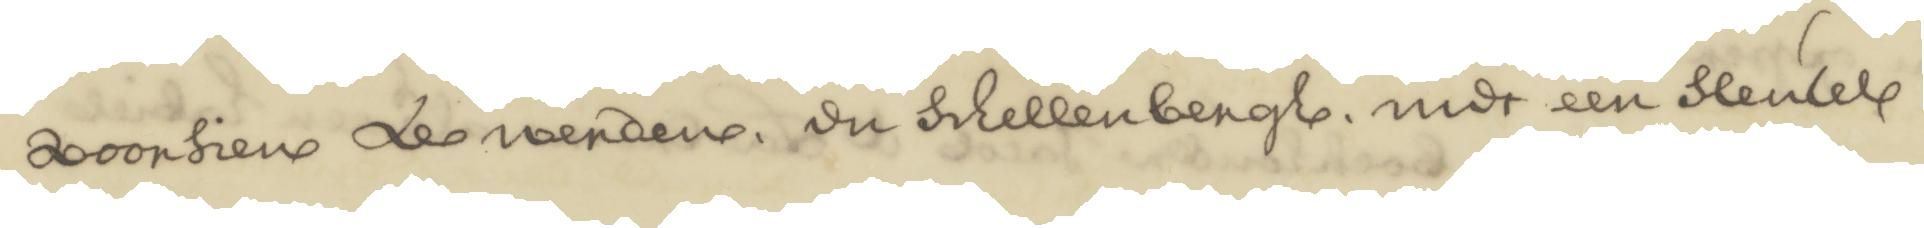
voorsien te werden, en schellenbergh, met een sleutel
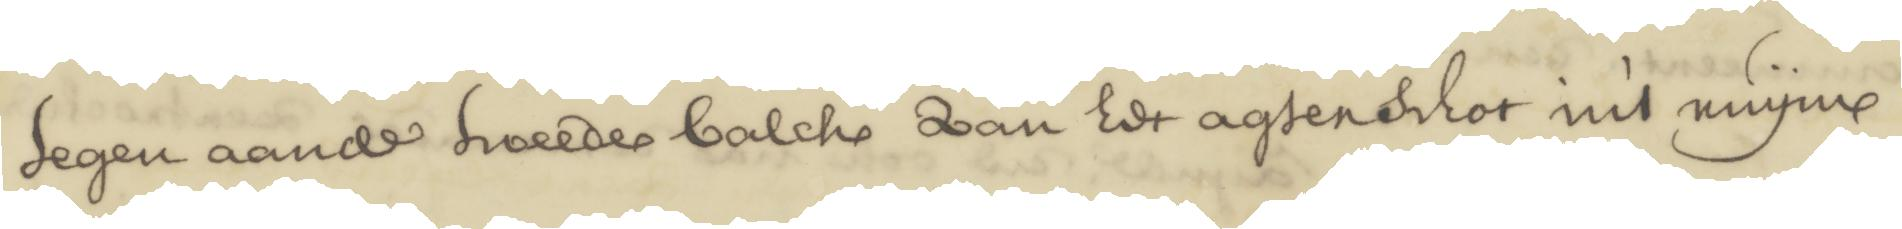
tegen aande tweede balck van het agterschot in't ruijm
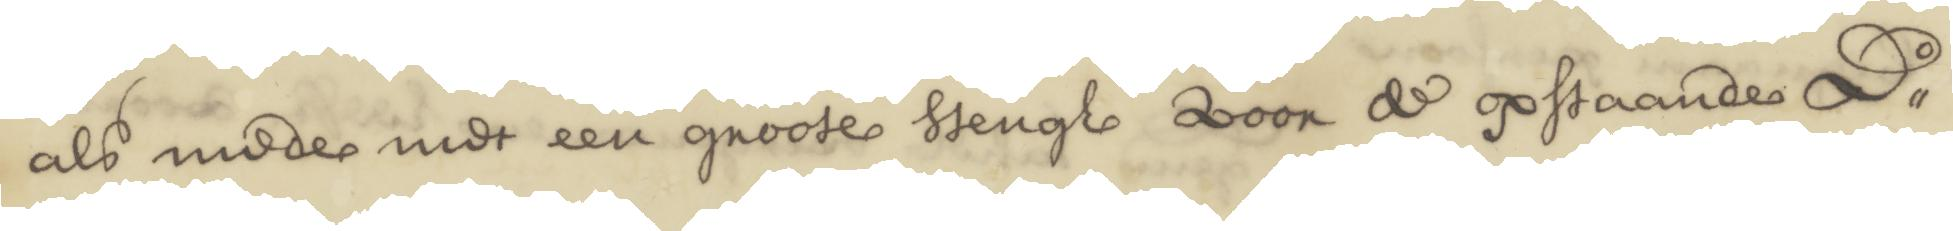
als mede met een groote stengh voor de opstaande D„o
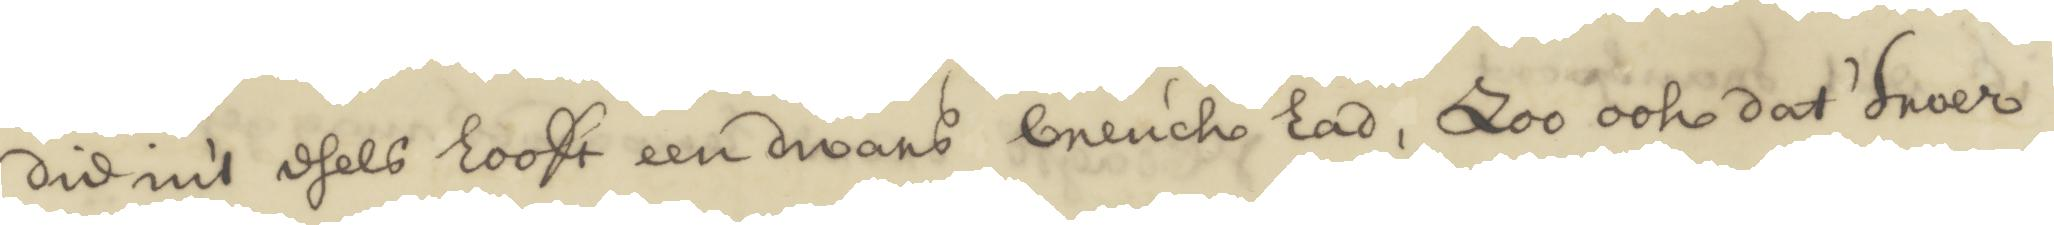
die in’t esels hooft een dwars breuck had, zoo ook dat 't roer
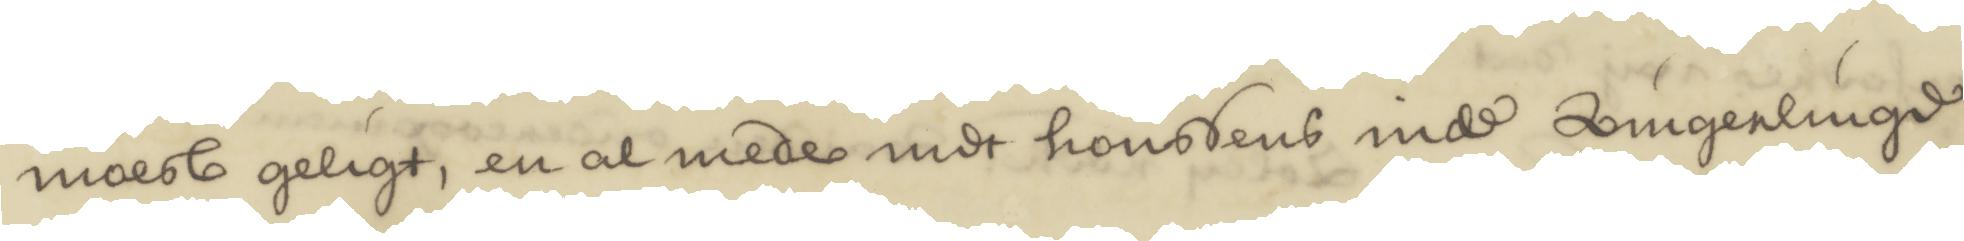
moest geligt, en al mede met koussens inde vingerlinge
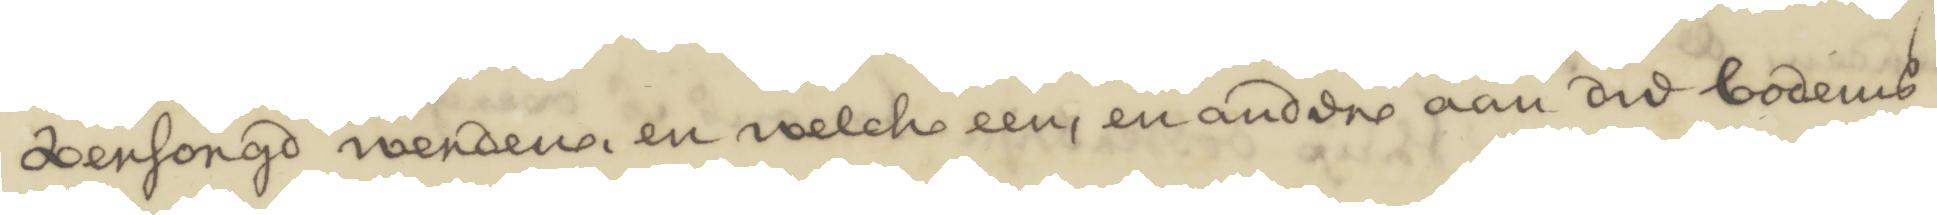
versorgd werden, en welck een, en ander aan die bodems
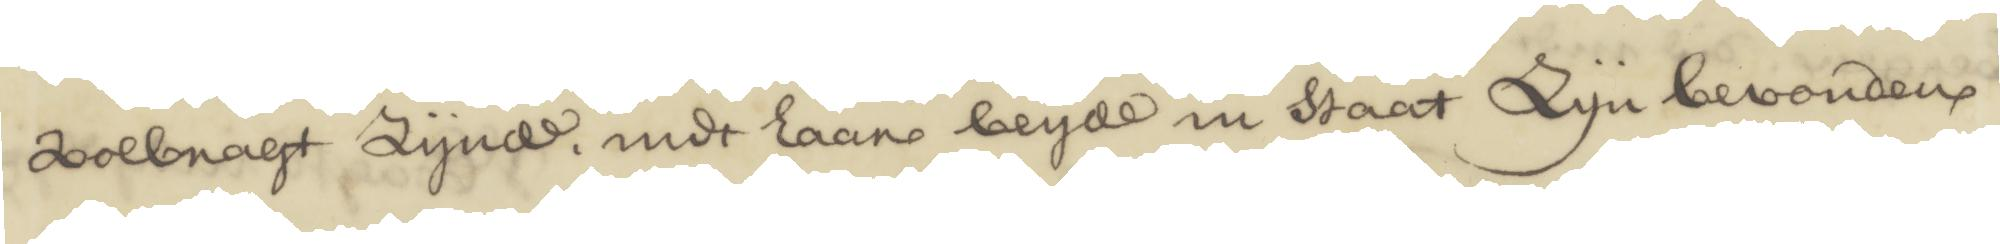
volbragt zijnde, met haar beijde in staat zijn bevonden
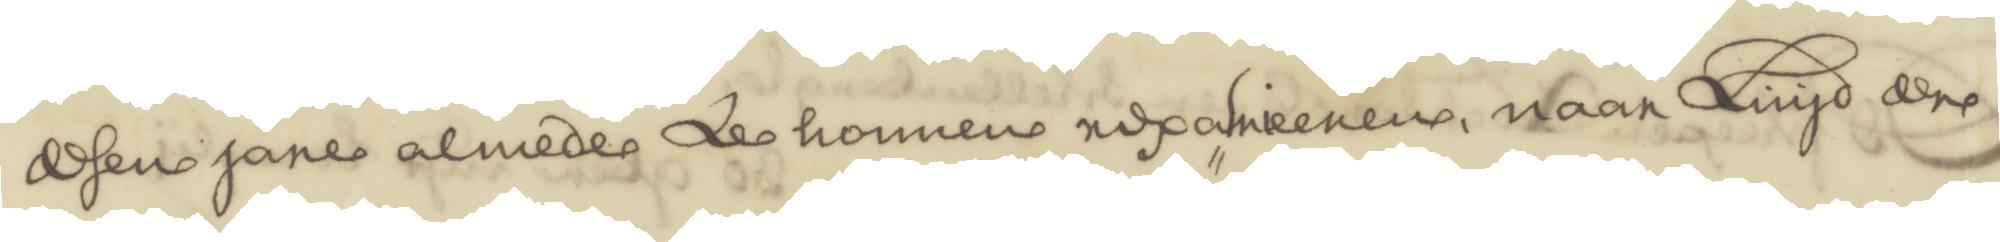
desen jare almede te konnen repatrieeren, naar Luijd der
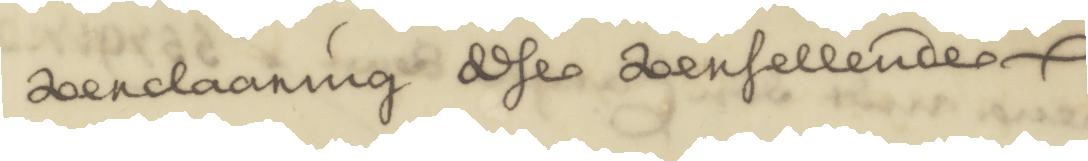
verclaaring dese versellende
